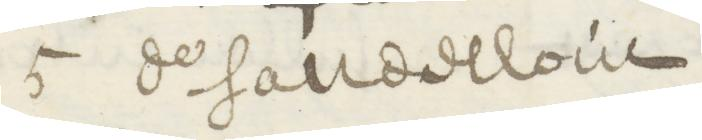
5 d.o sandelhout
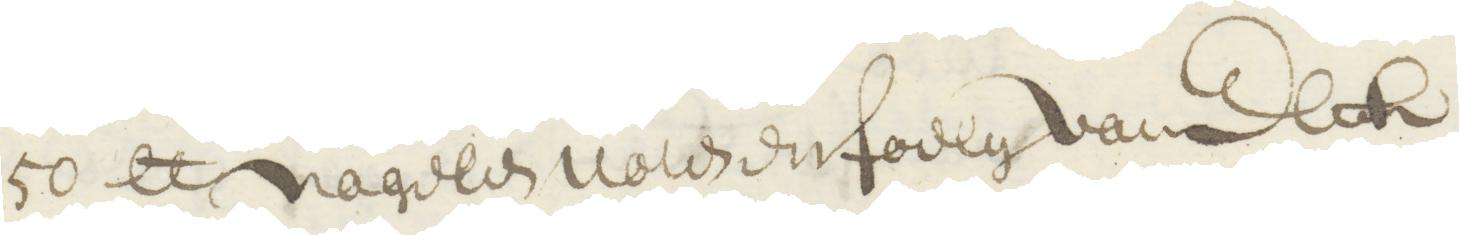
50 lb nagelen noten en foelij van Elck
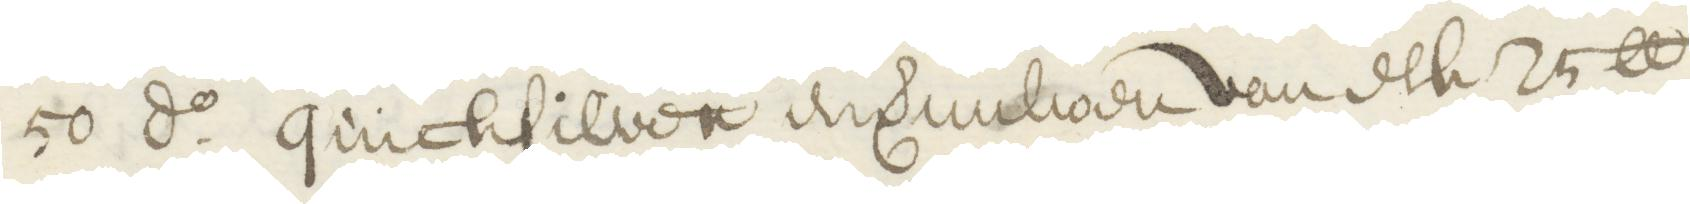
50 d.o quicksilver en vermilioen van elk 25 lb
